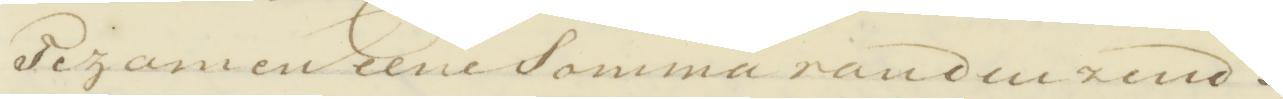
Tezamen eene somma van duizend —
